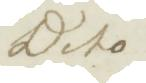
Dito . . . . . . . . . .
